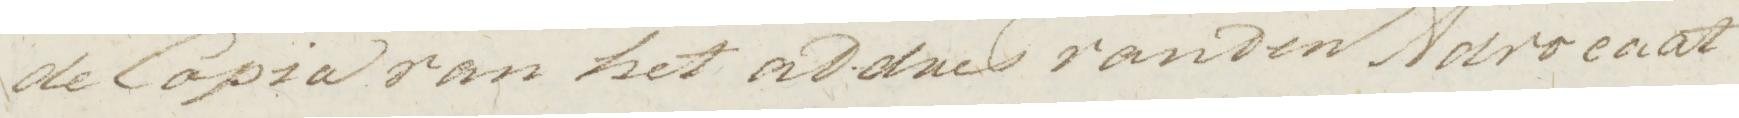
de Copia van het aldus van den Advocaat
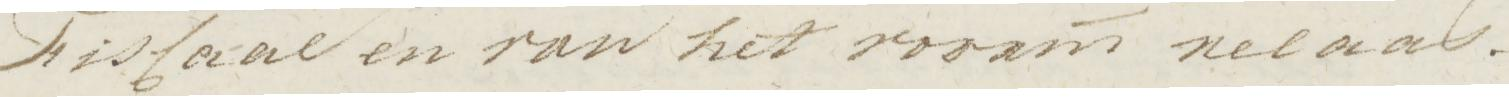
Fiscaal en van het voorm relaas.
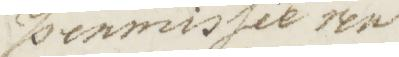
Permissie ver
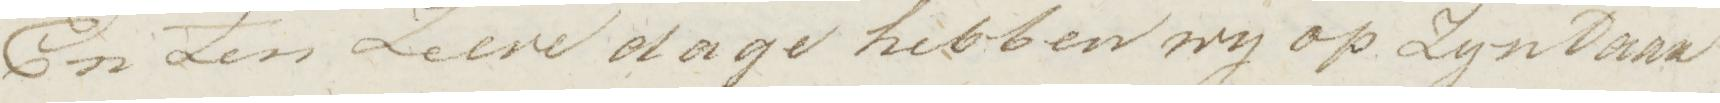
En ten Zeeve dage hebben wy op Zyn daar
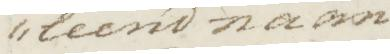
„leend naar
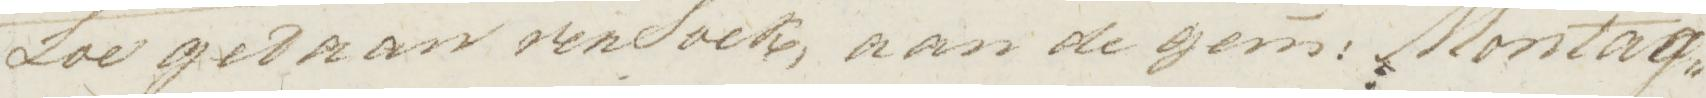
toe gedaan versoek aan de gem: Montag„
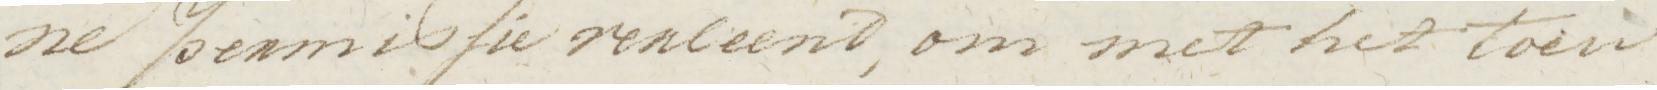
ne Permissie verleend, om met het toen
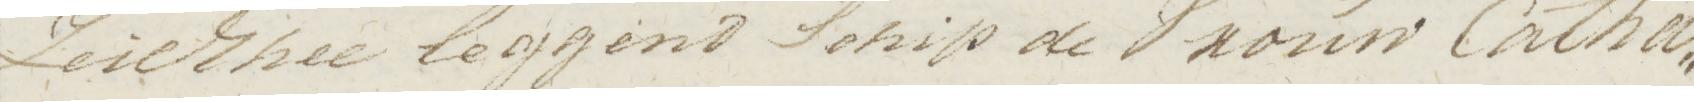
Zeilrhee leggend schip de Vrouw Catha„
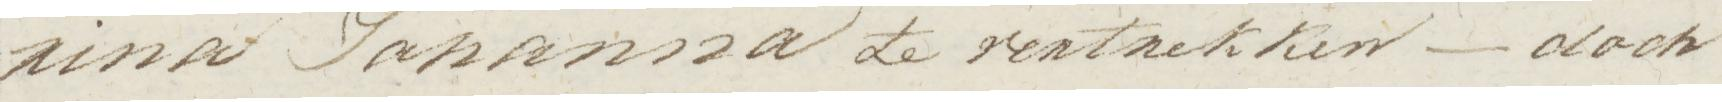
rina Iohanna te vertrekken — doch
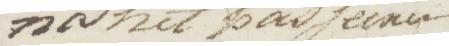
na het passeeren
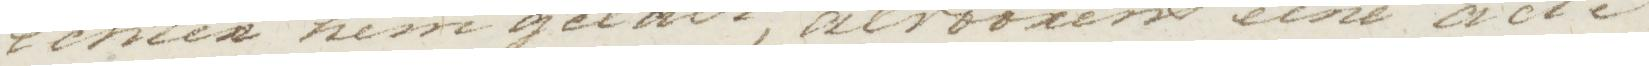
echter hem gelast alvoorens eene acte
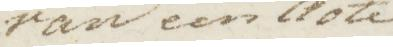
van een acte
